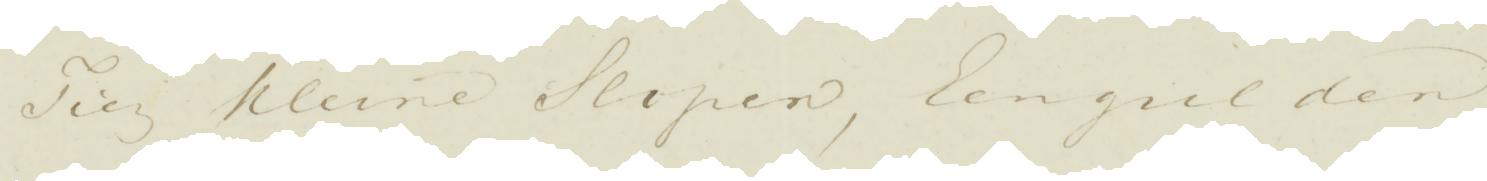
Tien kleine slopen, Een gulden
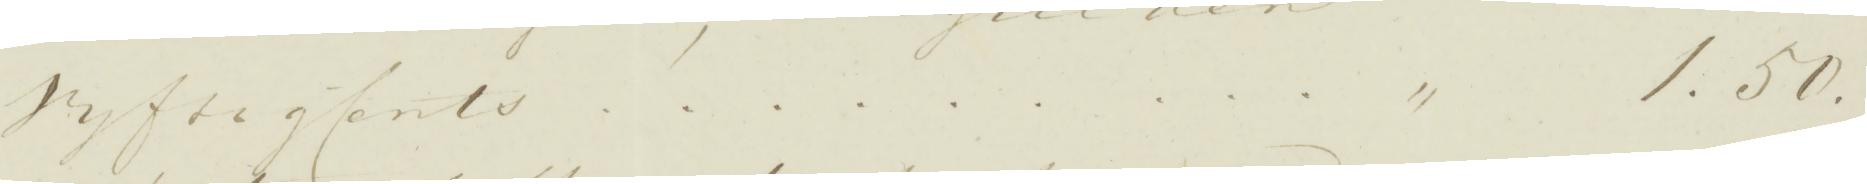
Vyftig Cents . . . . . . . . . „ 1. 50.
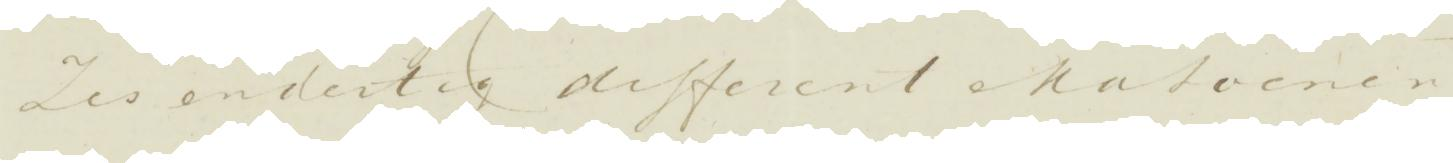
Zes en dertig different katoenen
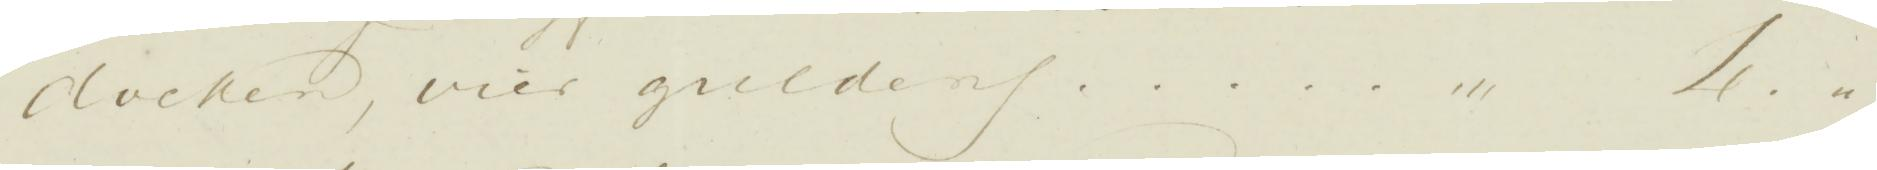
doeken, vier guldens . . . . . „ 4. „
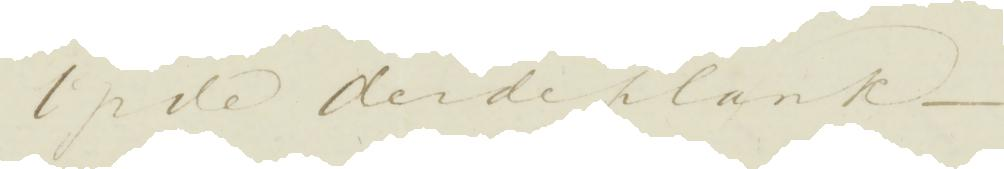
Op de derdeplank
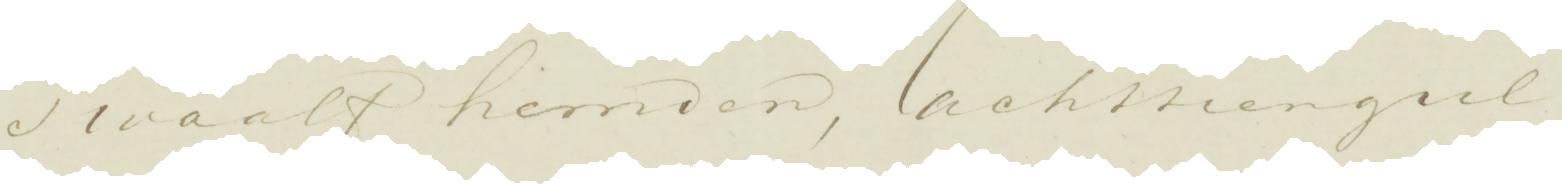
Twaalf hemden, achttien gul
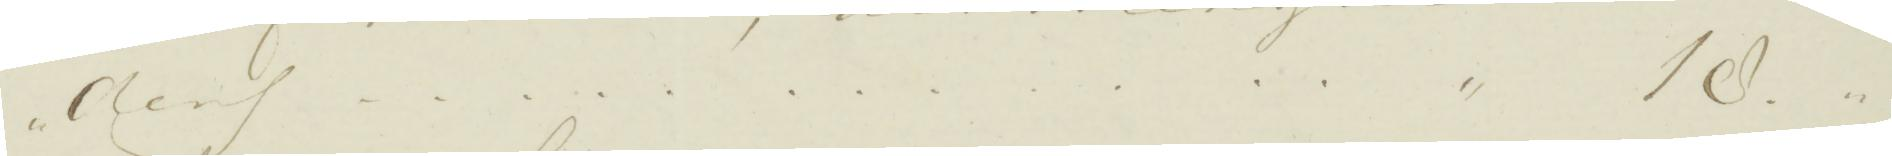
„dens . . . . . . . . . . . . „ 18. „
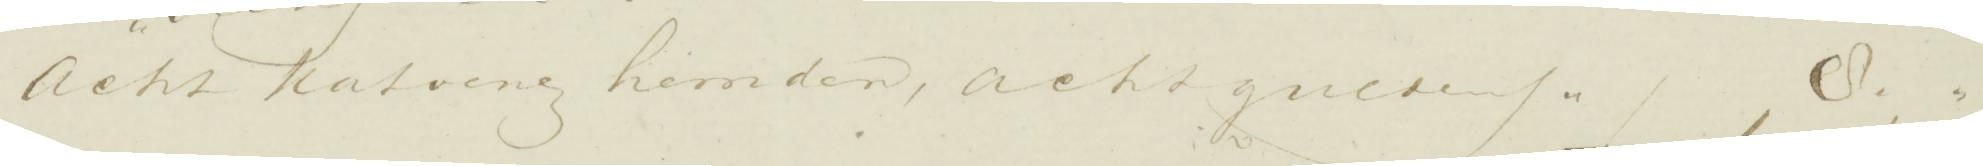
Acht katoenen hemden, acht guldens „ 8. „
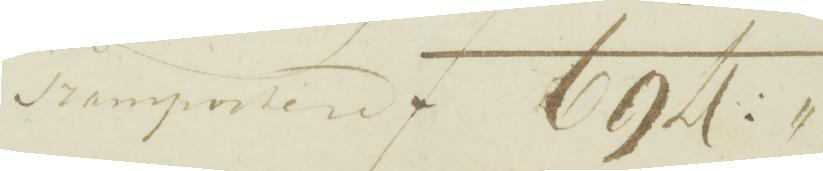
Transporten ƒ 694: „
